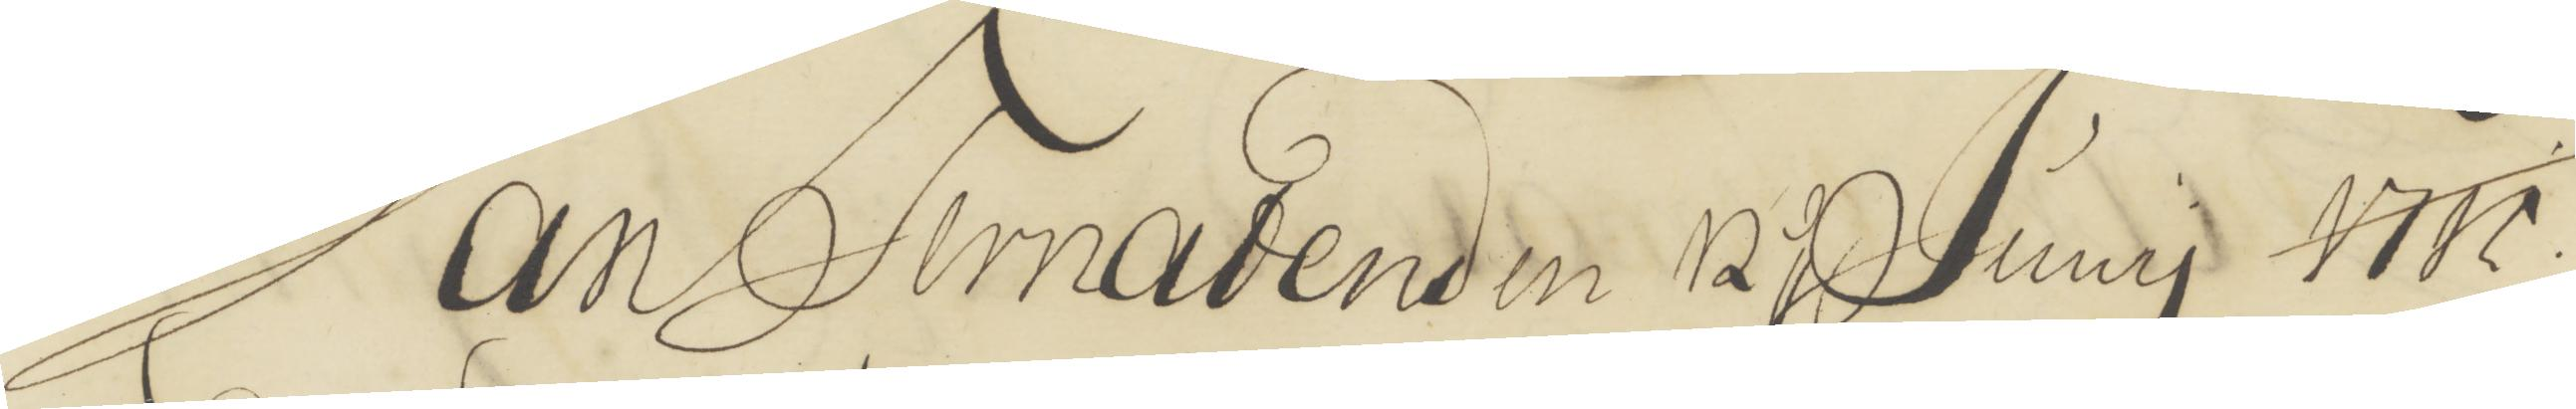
Van Ternaten den 12„' Iunij 1715.
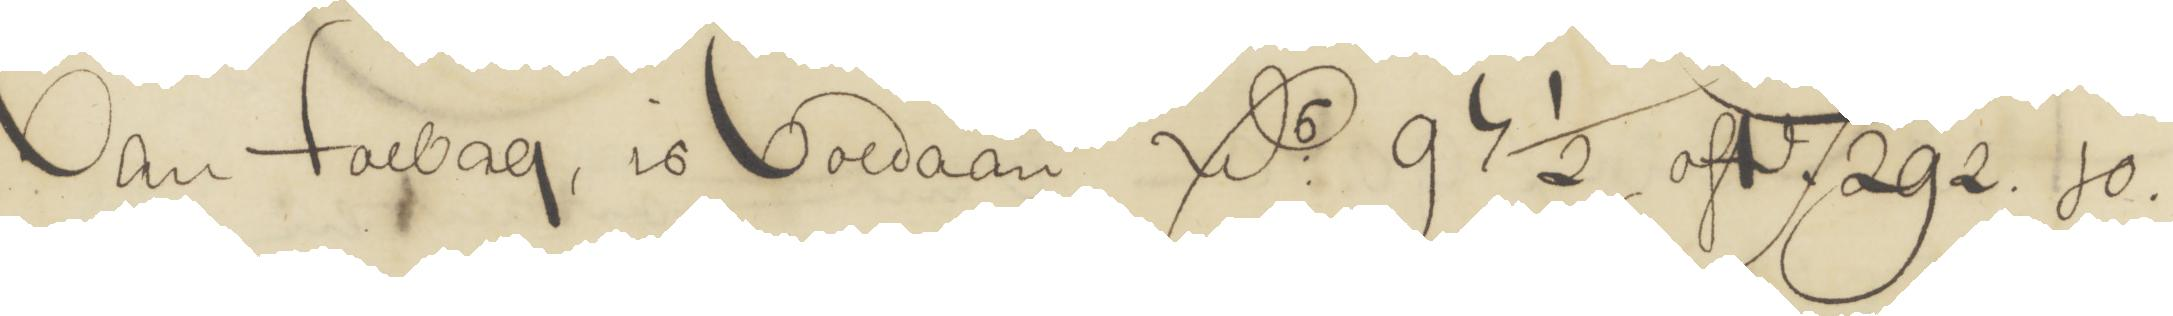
Van toebaq, is voldaan p=s 97½ ofte ƒ292.10.
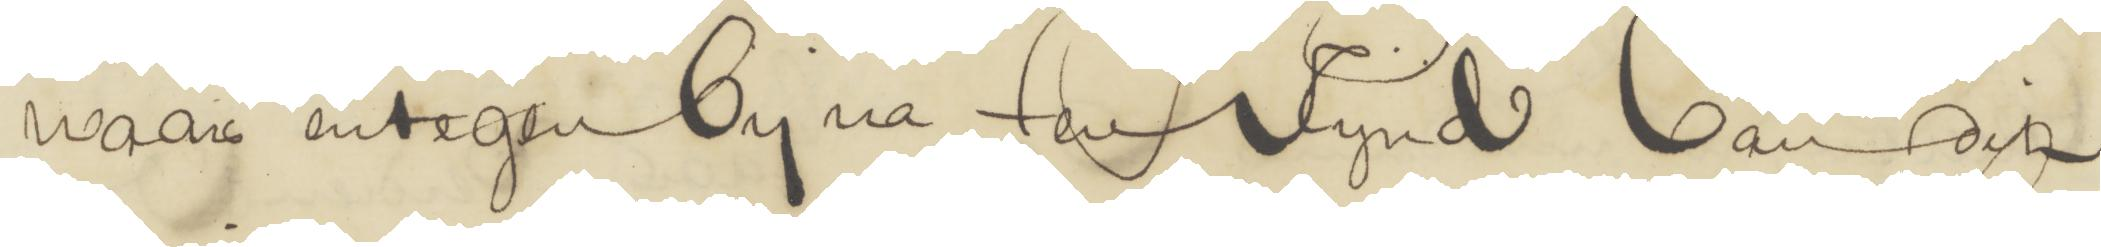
waar en tegen bij na ten Eijnde van dit
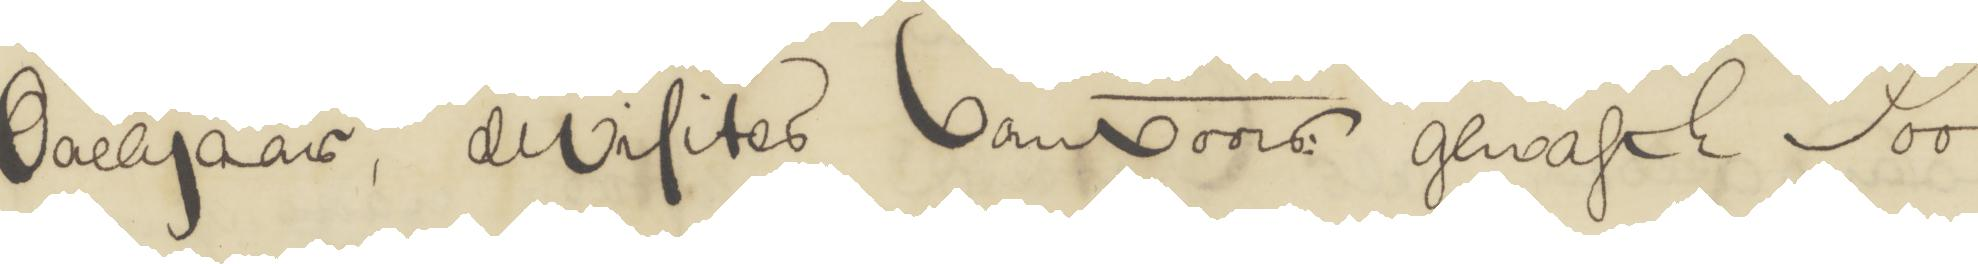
boekjaar, de visites van voors: gewasch Soo
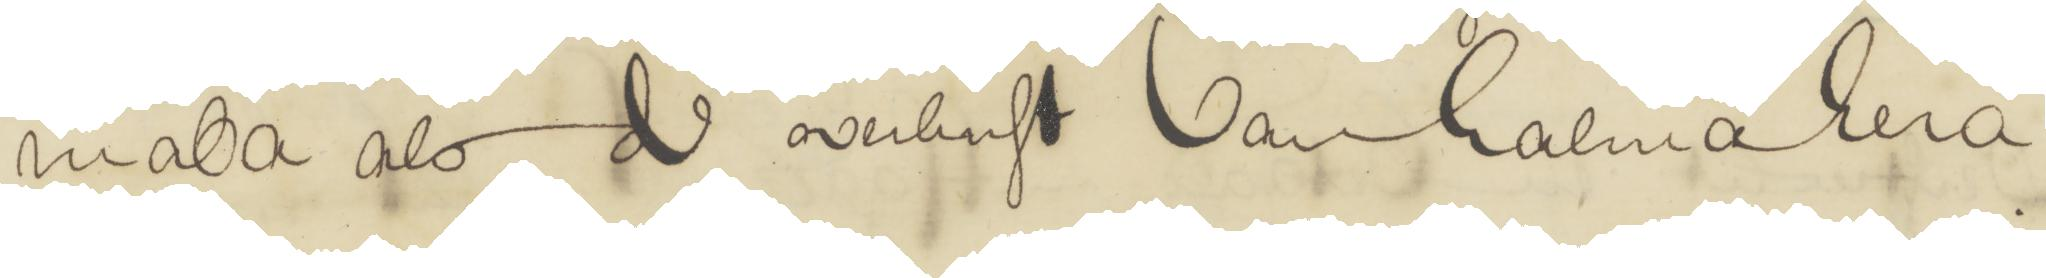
maba als de overkust van halma hera
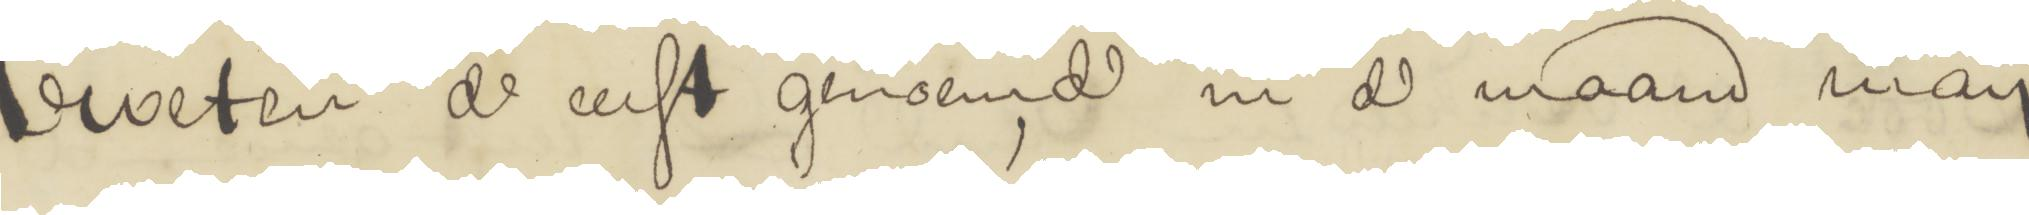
teweten de eerst genoemde in de maand maij
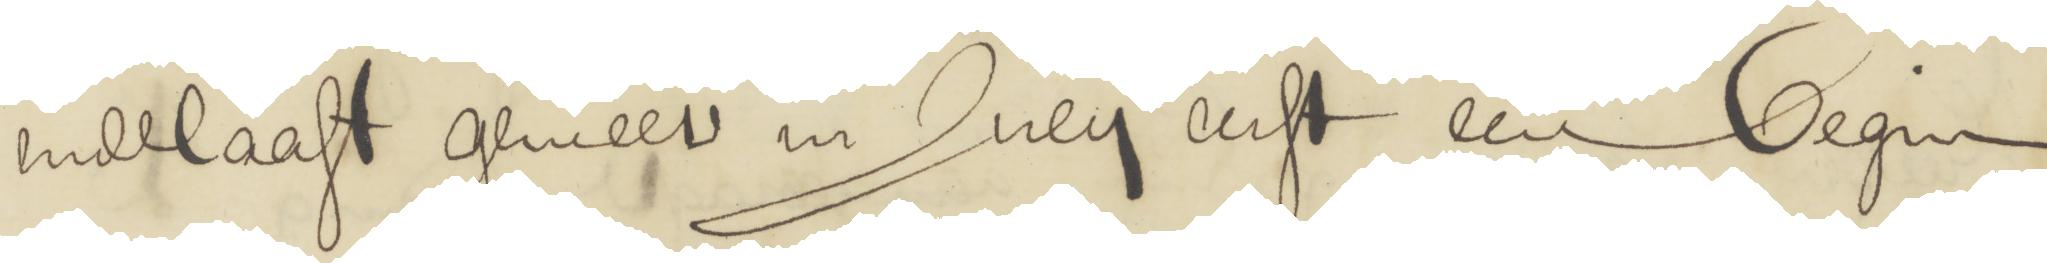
ende laast gemelte in Julij eerst een begin
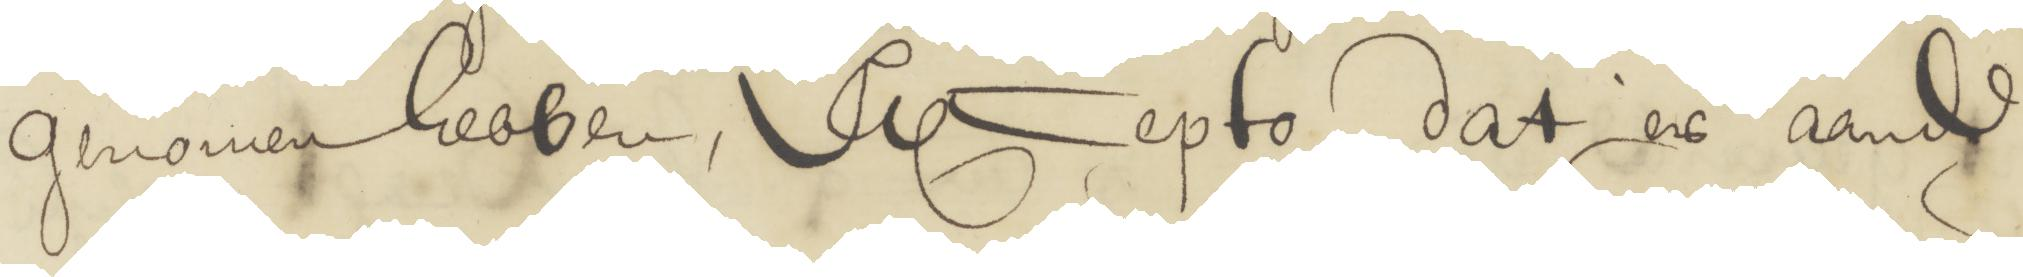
genomen hebben, Excepto dat 'er aande
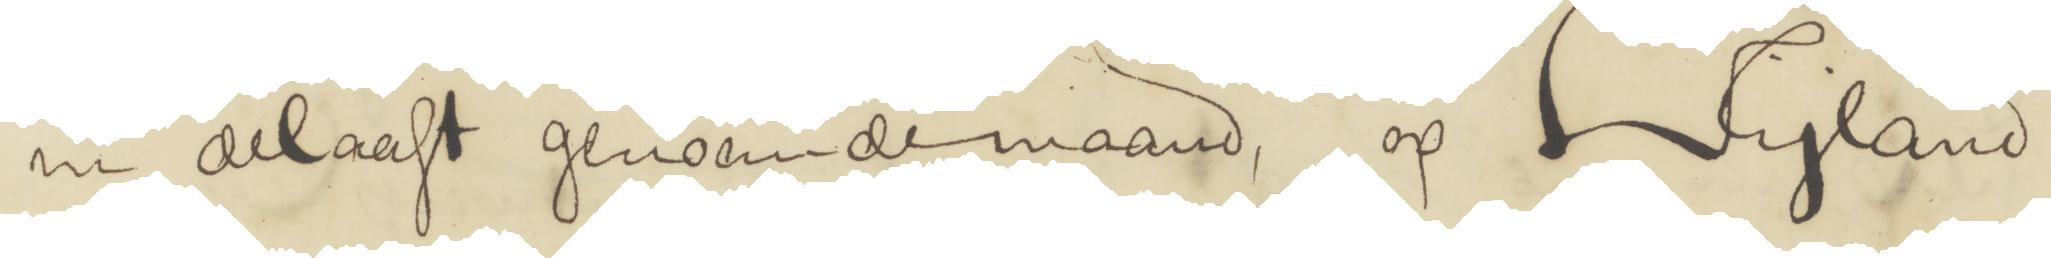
in delaast genoemde maand, op t Eijland
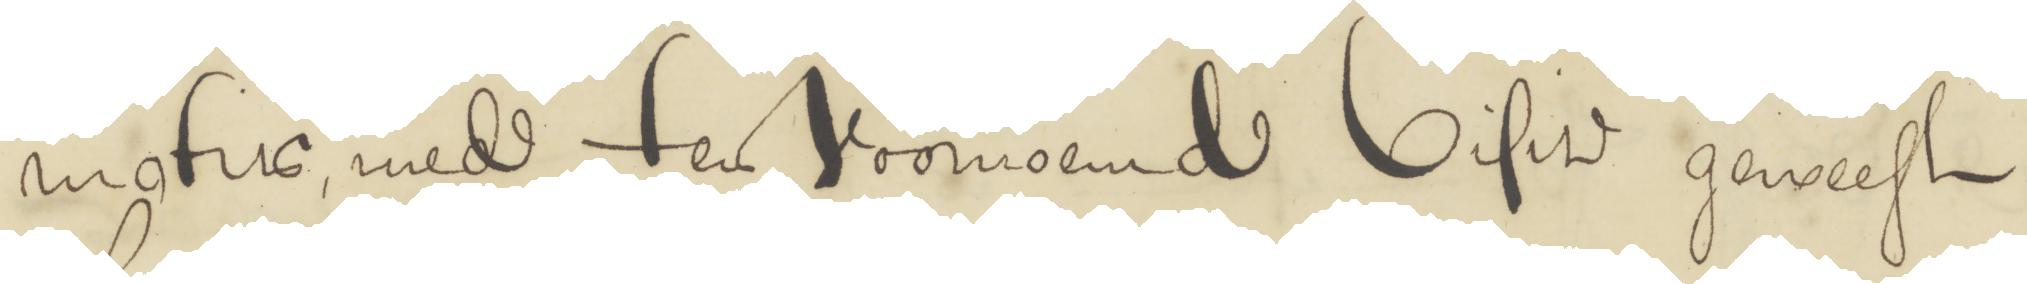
motus, mede ter voornoemde Visite geweest
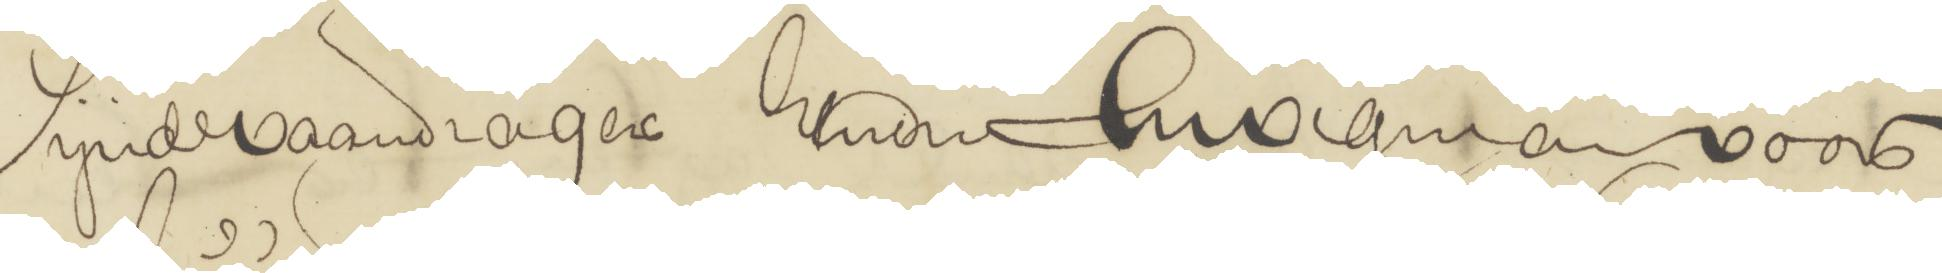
Sijnde vaandrager hendrick wigman voors
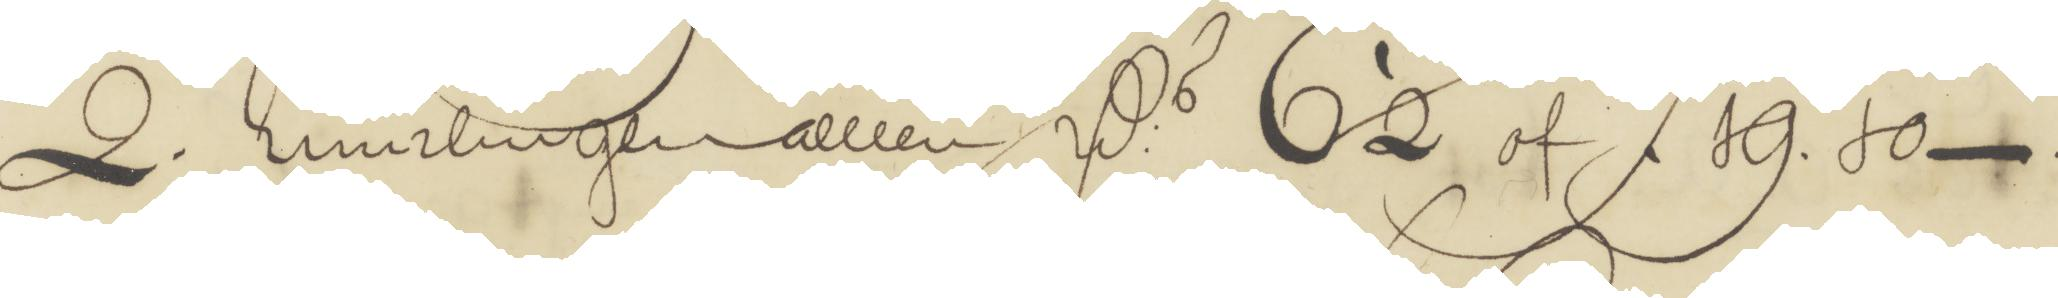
2. huurlingen alleen p:s 6½ of ƒ19.10—
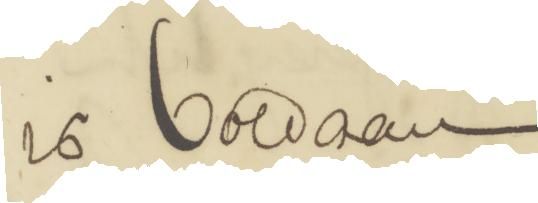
is voldaan
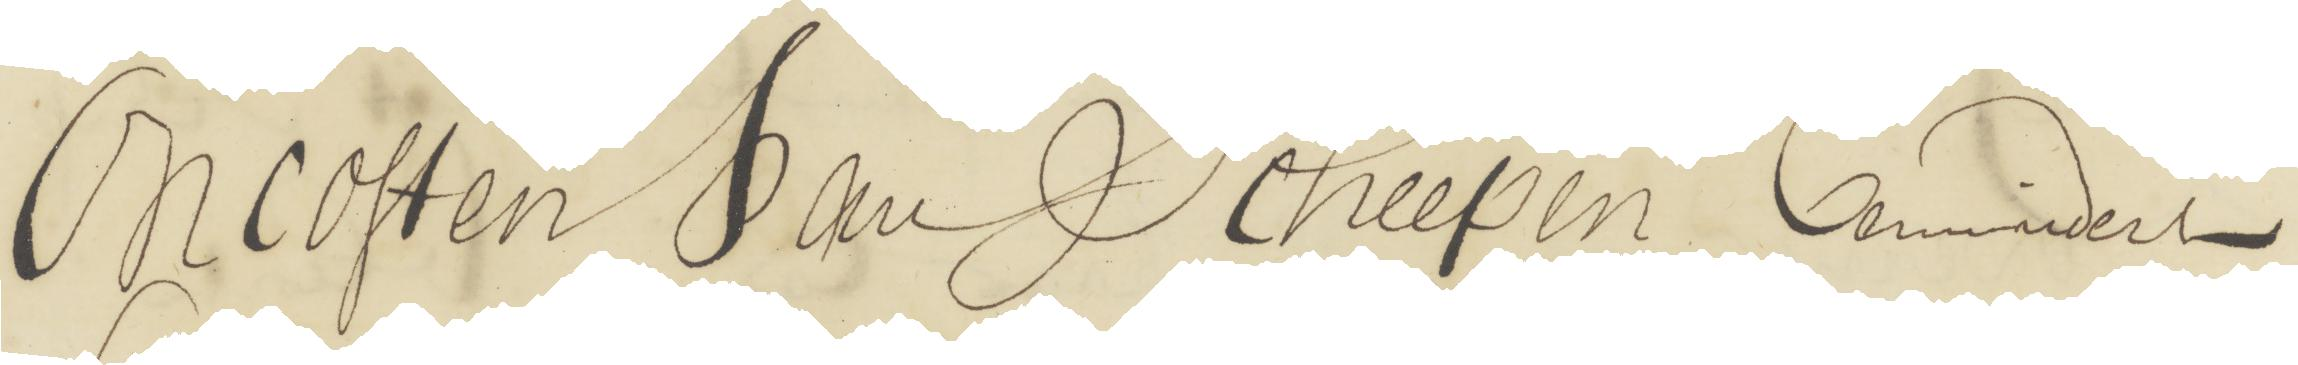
Oncosten Van Scheepen vermindert
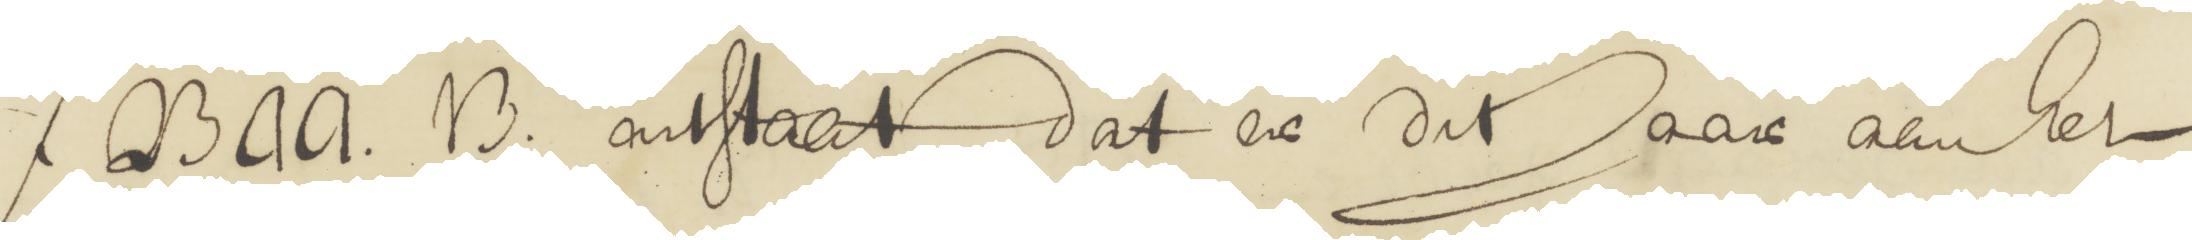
ƒ 2344.13. ontstaat dat er dit Jaar aan het
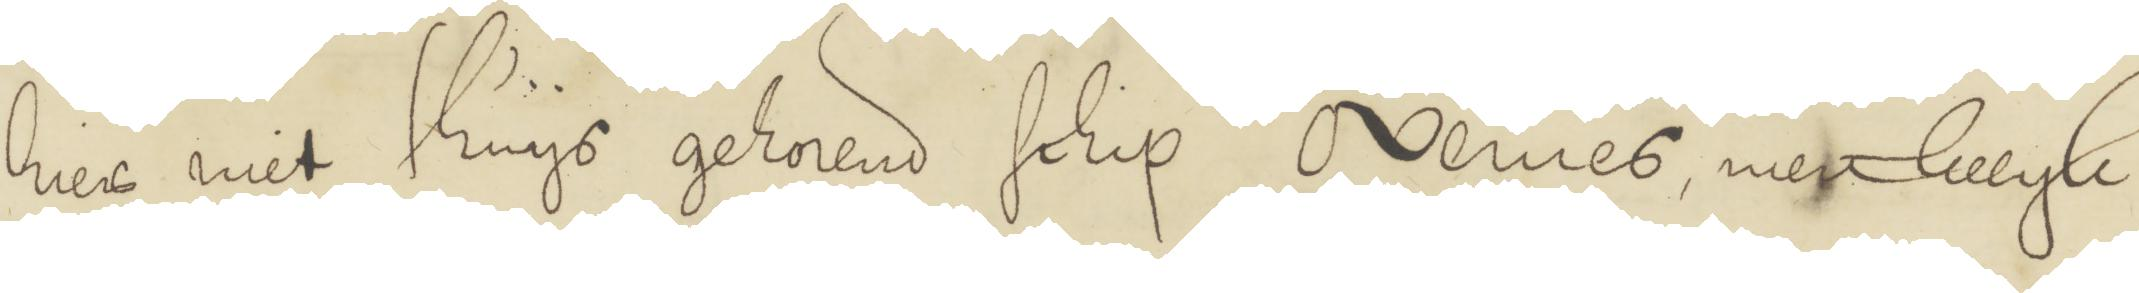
hier niet thuijs gehorend schip overnes, merckelijk
